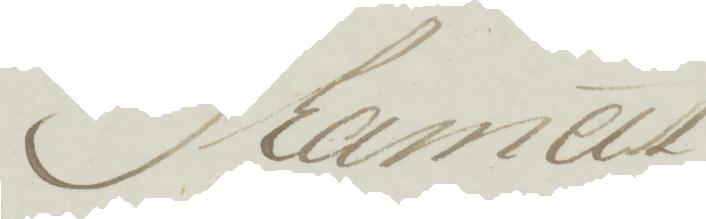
Thamat
